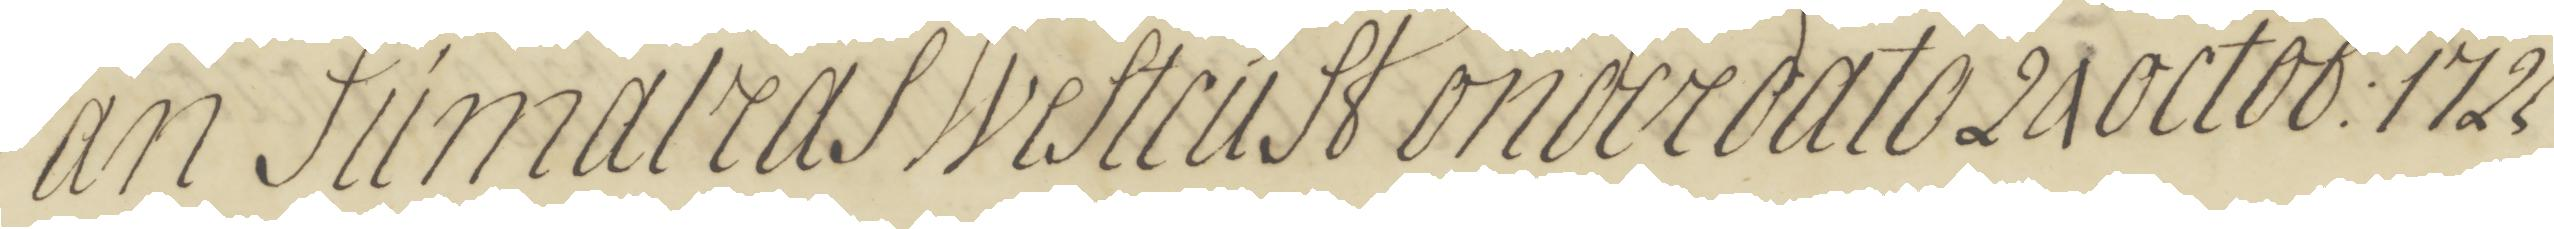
an Sumatras westcust onder dato 24 octob: 1725
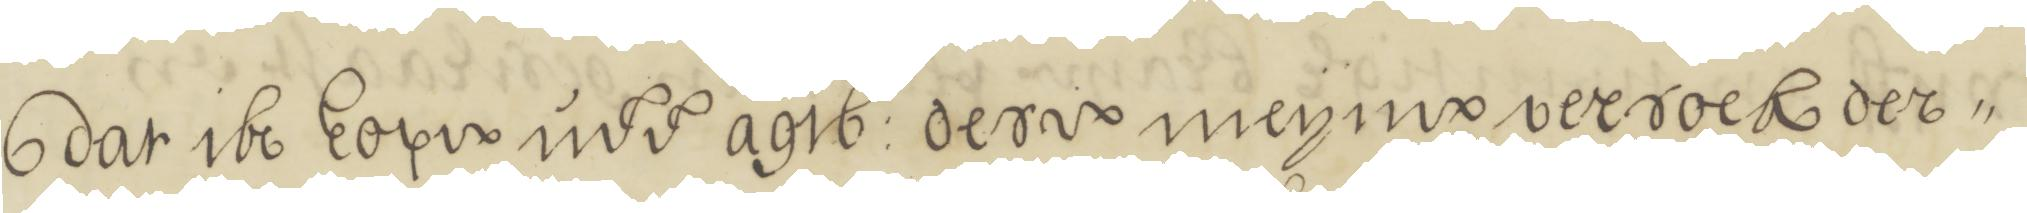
dat ik hope uEE agtb:re dese meijne versoek der„
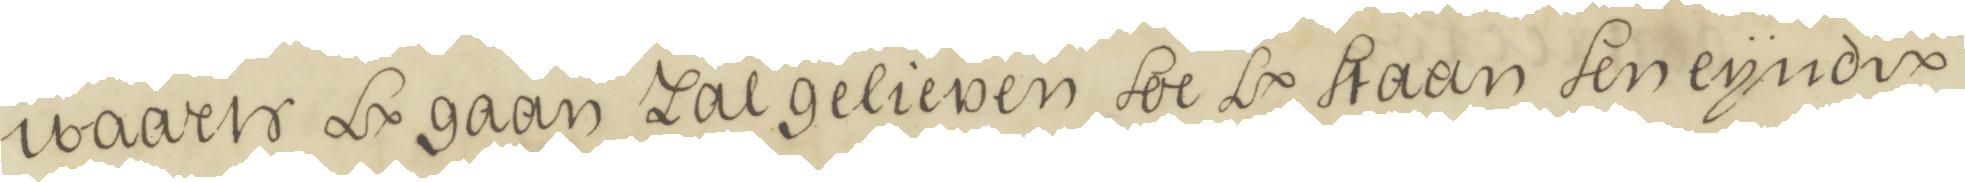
waarts te gaan zal gelieven toe te staan ten eijnde
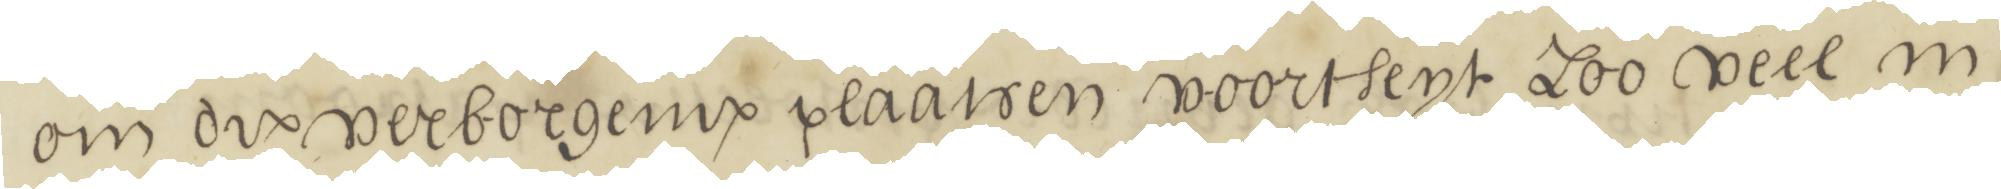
om de verborgene plaatsen voortseijt zoo veel in
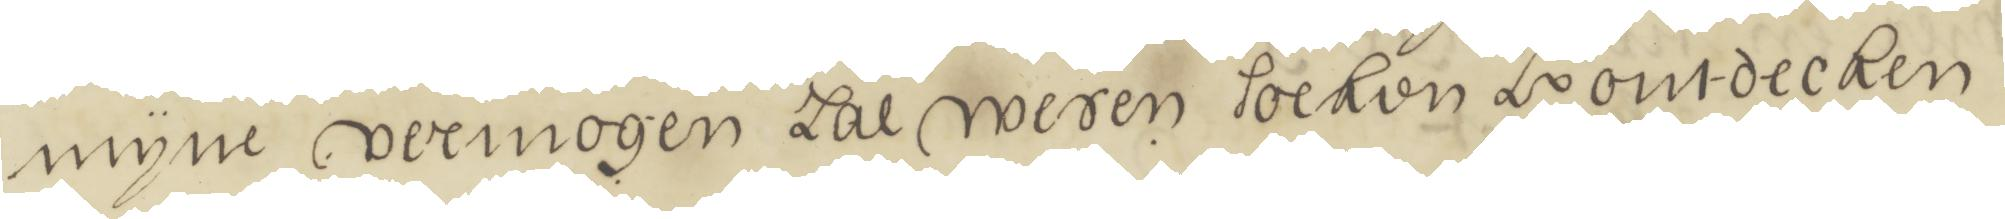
mijne vermogen zal wesen soeken te ontdecken
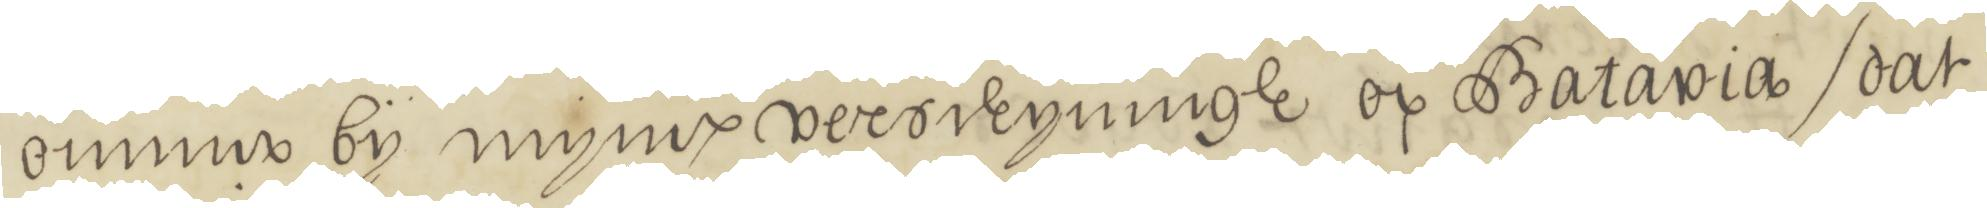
omme bij mijne verschijningh op Batavia / dat
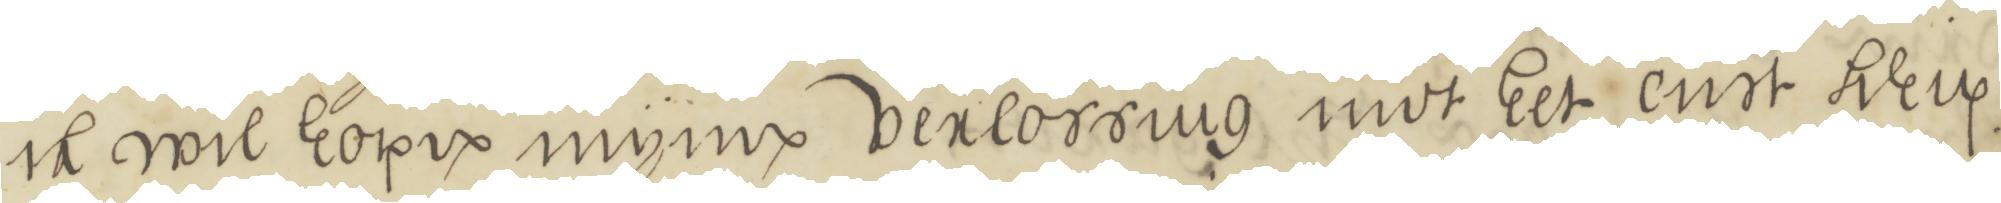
ik wil hope mijne Verlossing met het cust schip
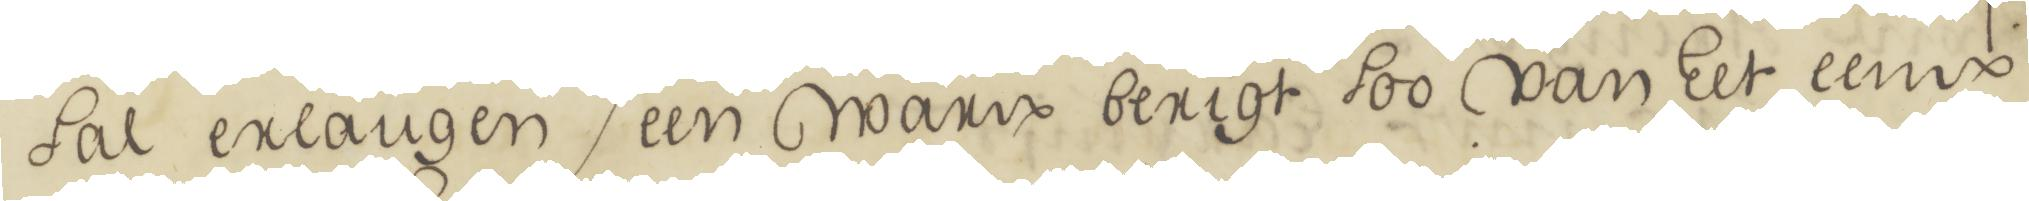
sal erlangen / een ware berigt soo van het eene
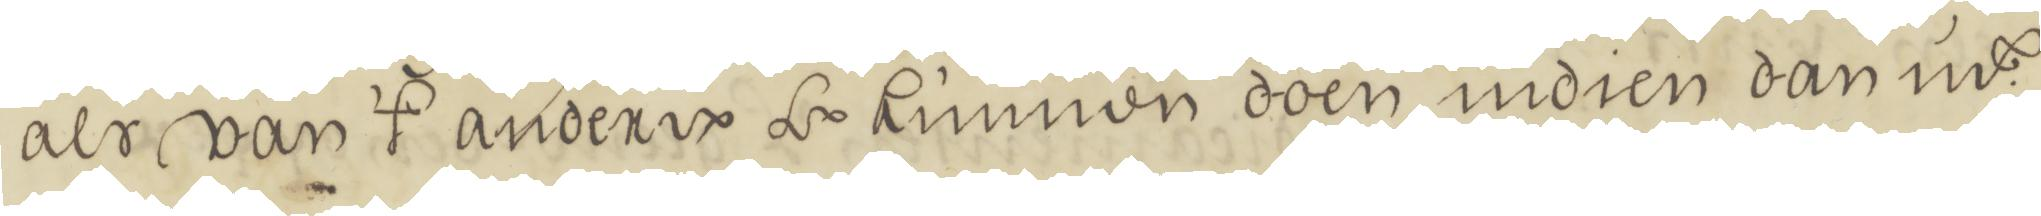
als van 't andere te kunnen doen indien dan uE.
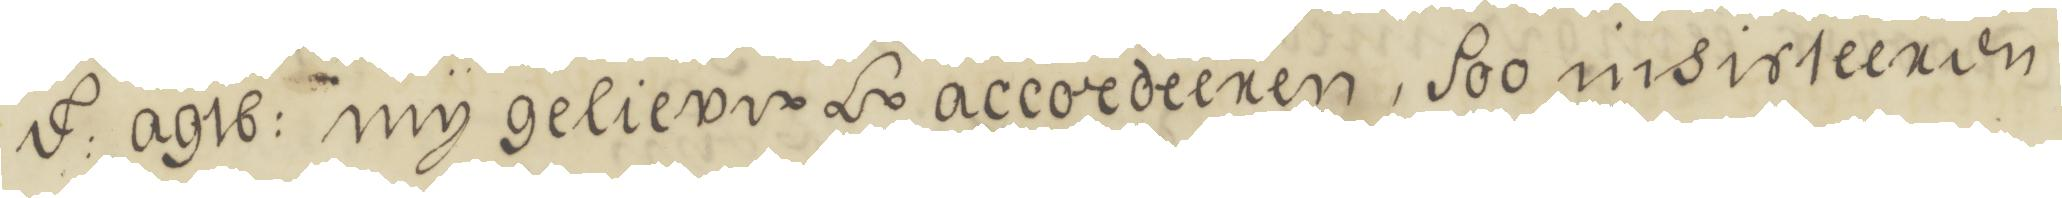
E: agtb: mij gelieve te accordeeren, soo insisteeren
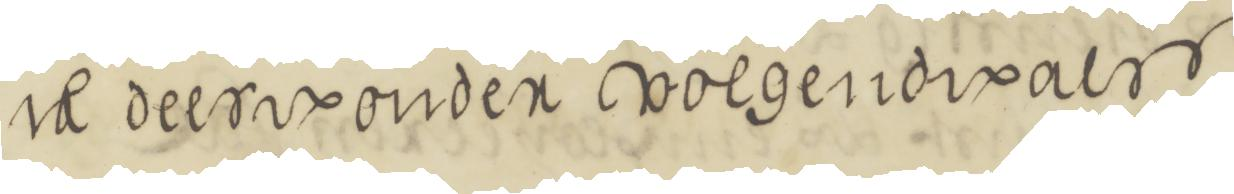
ik deese onder volgende alss
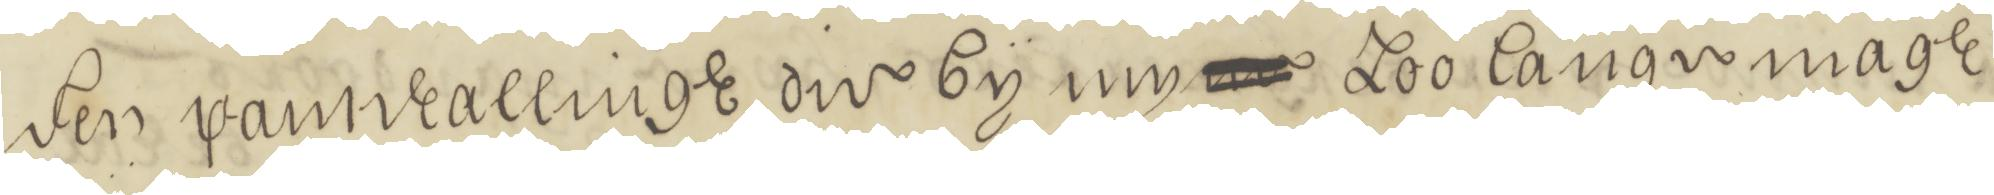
Een pantchallingh die bij mij m zoo lange magh
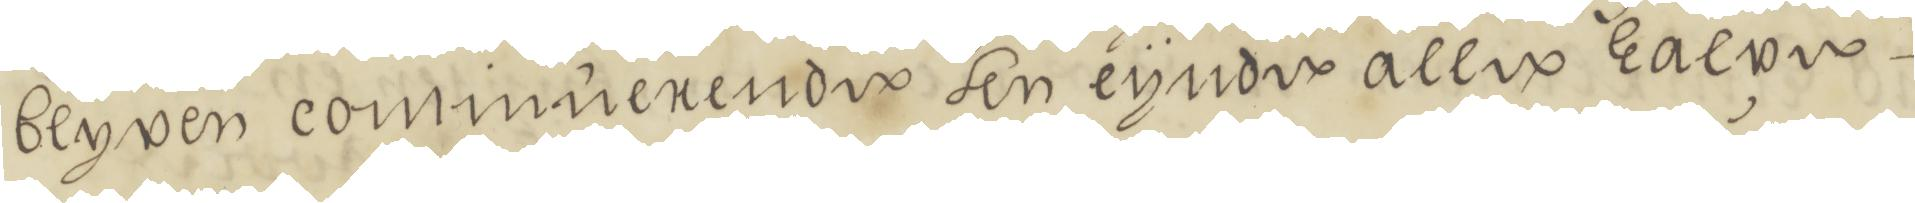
blijven continuerende ten eijnde alle halve
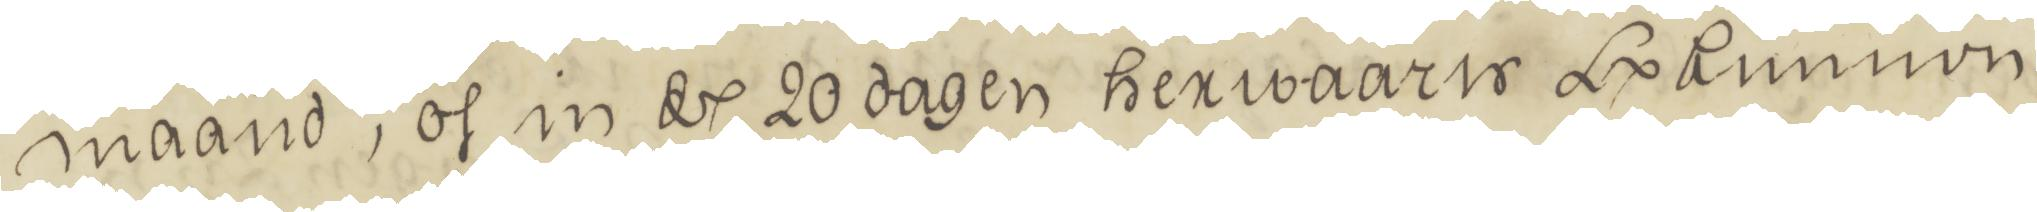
maand, of in de 20 dagen herwaarts te kunnen
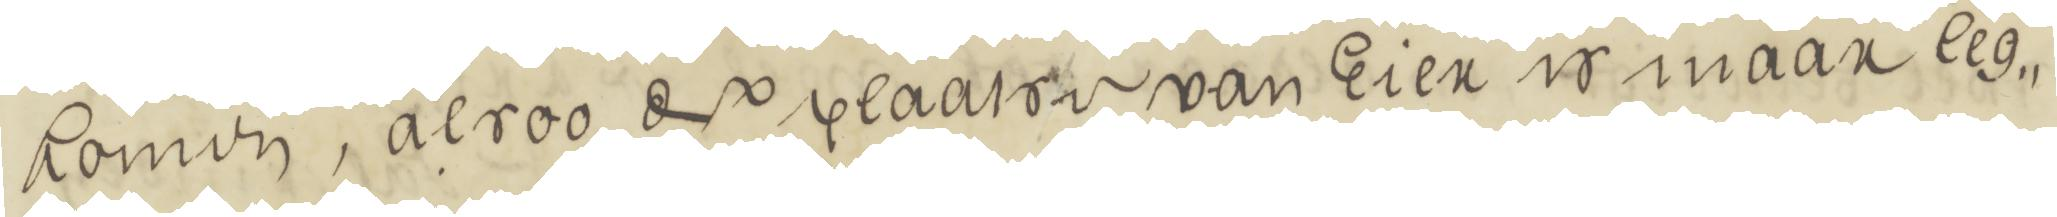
komen, alsoo de plaatse van hier is maar leg„
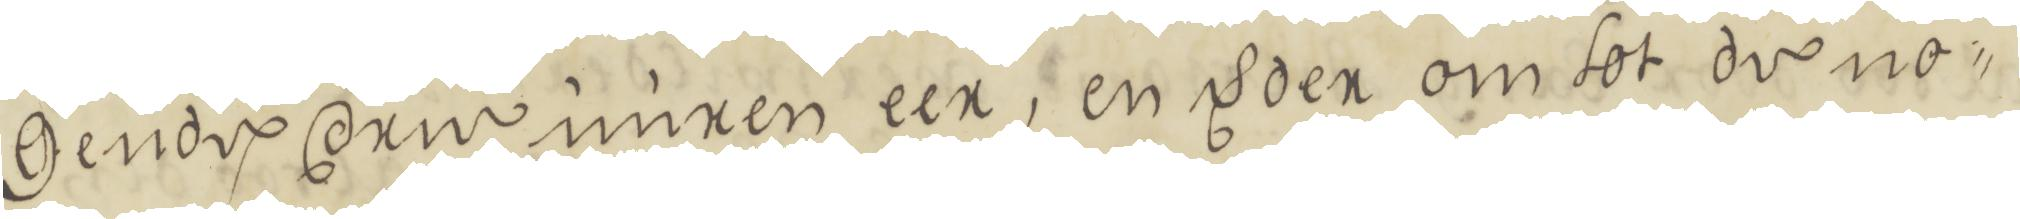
gende drie uuren eer, en verder om tot de no„
